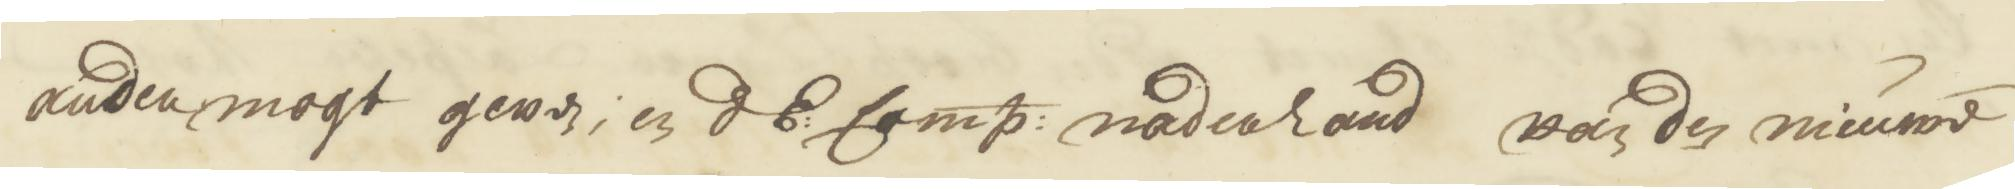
ander mogt geven; en dE: Comp: naderhand van den nieuwe
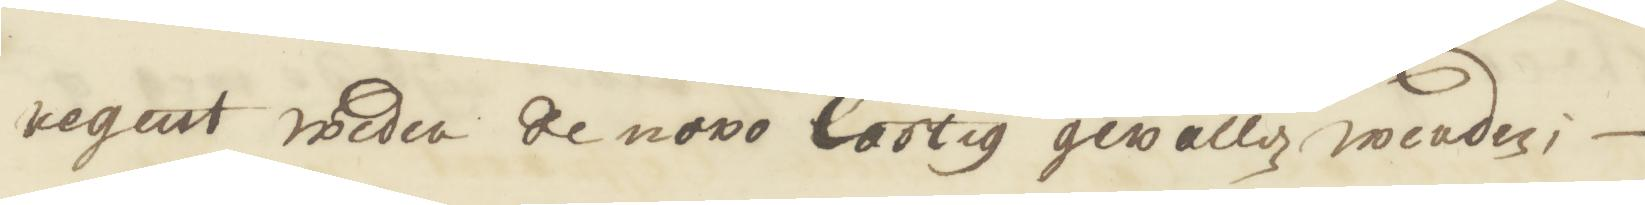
regent weder de novo lastig gevallen werden;
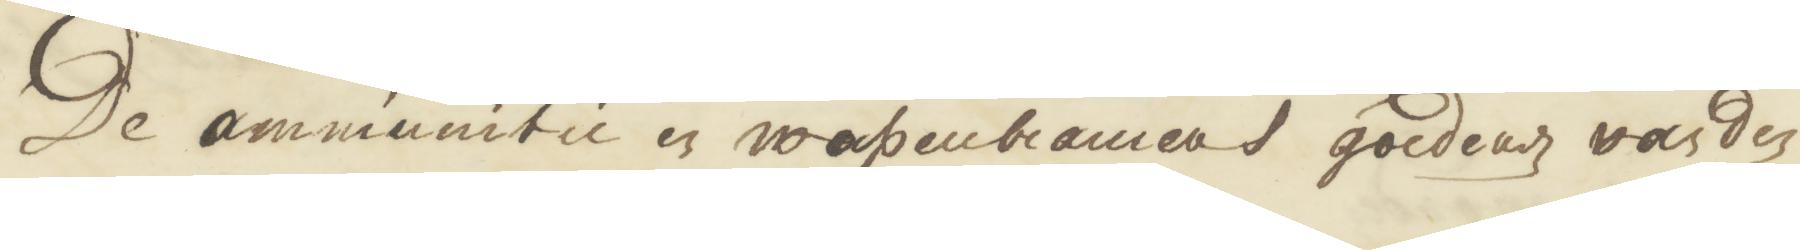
De ammunitie en wapenkamers goederen van den
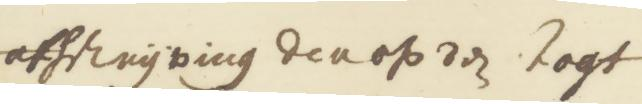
afschrijving der op den togt
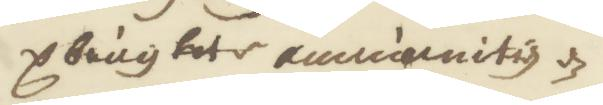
verbruijkte ammunitien en
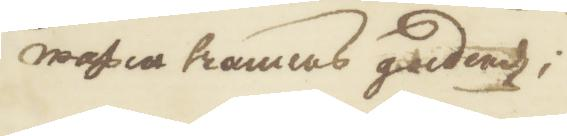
wapen kamens goederen;
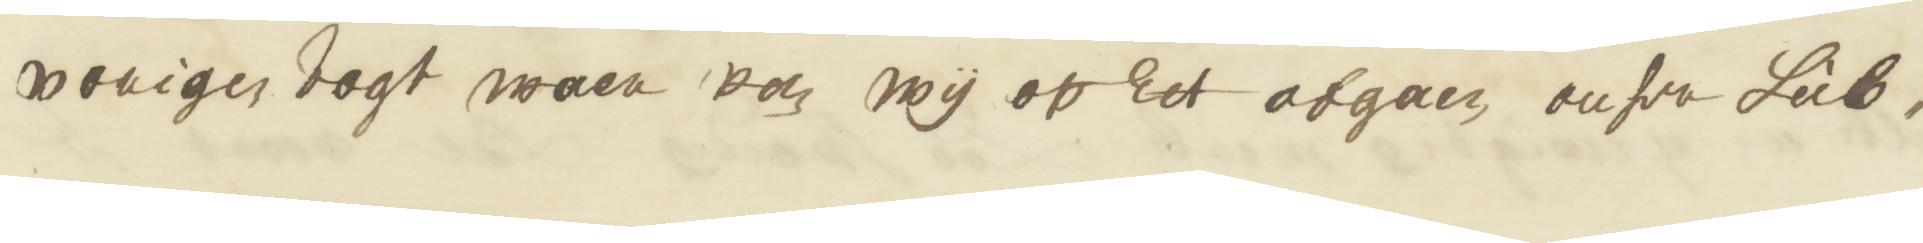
vorigen togt waer van wij op het afgaen onser sub„
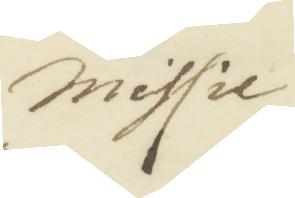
„missie
